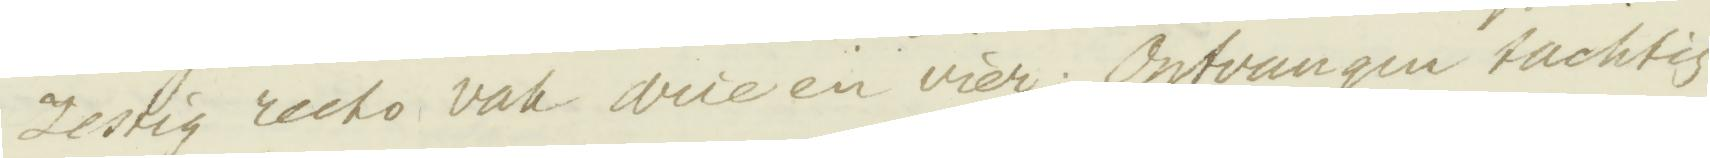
Zestig recto vak drie en vier. Ontvangen tachtig
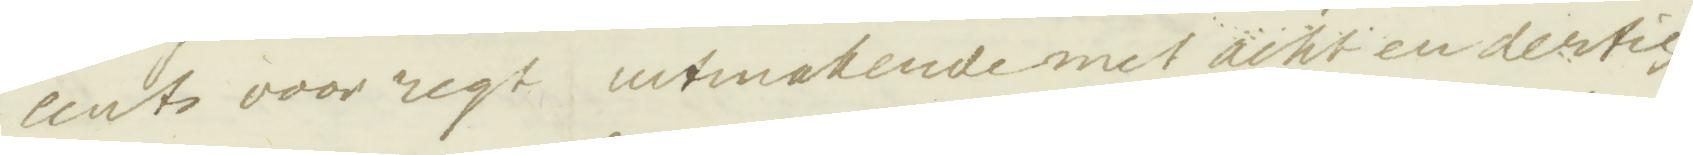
cents voor regt uitmakende met acht en dertig
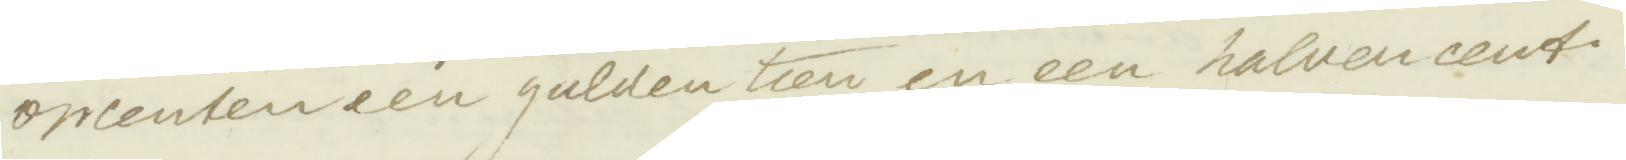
opcenten een gulden tien en een halven cent
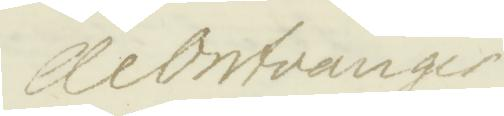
de Ontvanger
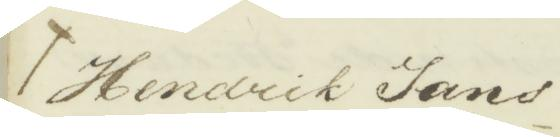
¶ Hendrik Ians
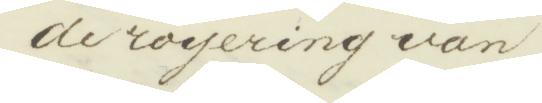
de royering van
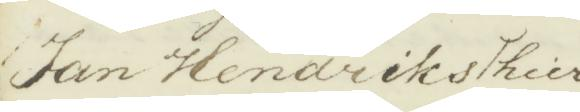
Ian Hendriks ¶ hier
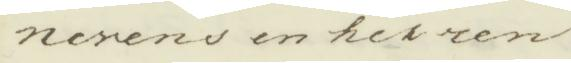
nevens en het ren
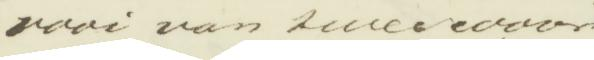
vooi van twee woor
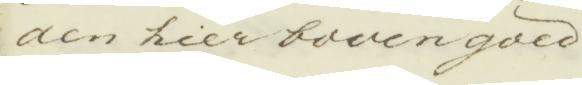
den hier boven goed
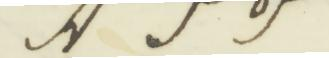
A S P
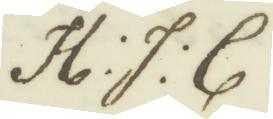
H: J: C.
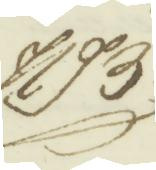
H J B
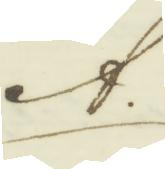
A.
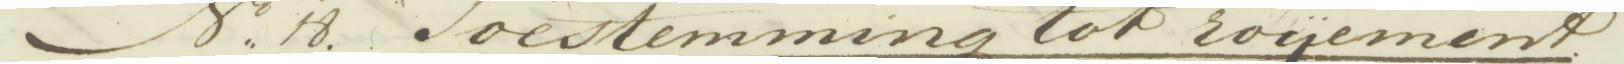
N„o 18 Toestemming tot roijement.
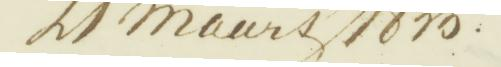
21 Maart 1835.
